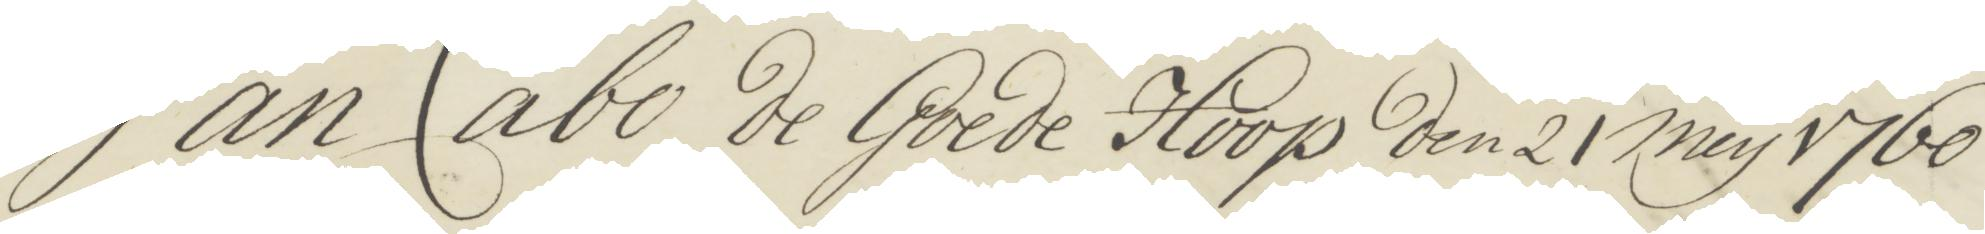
Van Cabo de Goede Hoop den 21 meij 1760
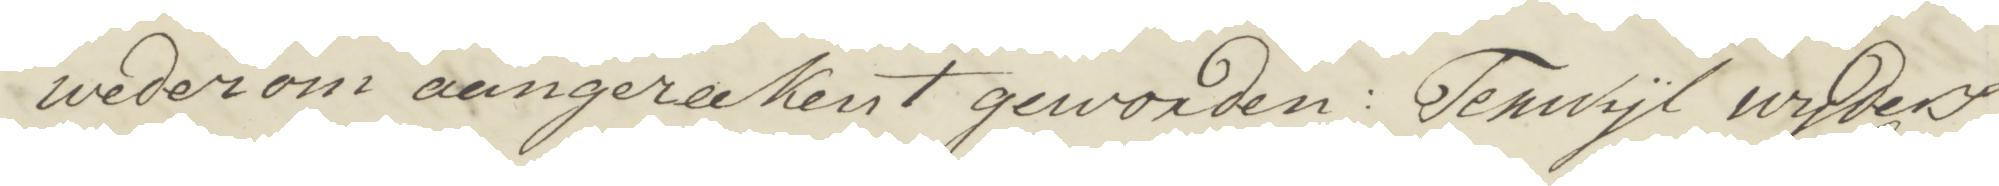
wederom aangereekent geworden: Terwijl wyders,
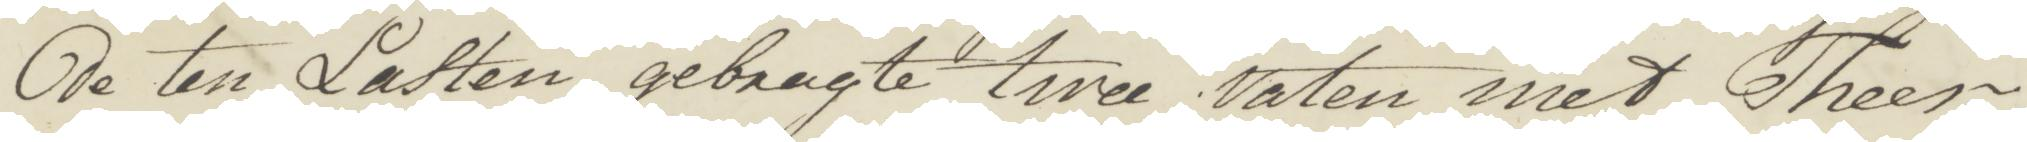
de ten Lasten gebragte twee vaten met Theer
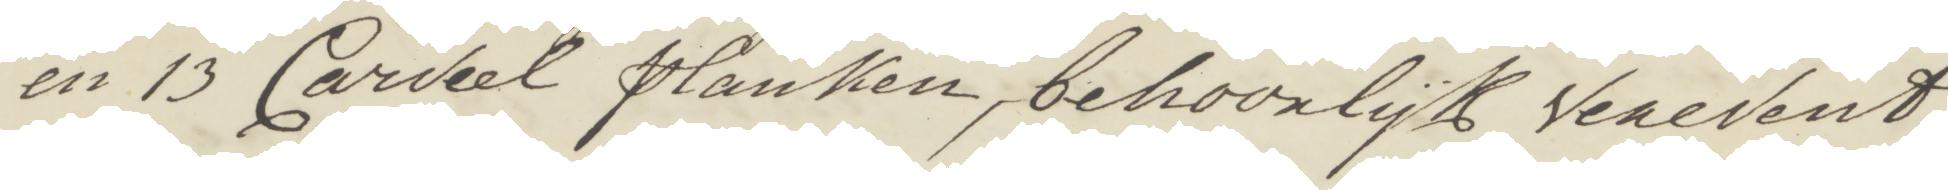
en 13 Carveel planken, behoorlijk verevent,
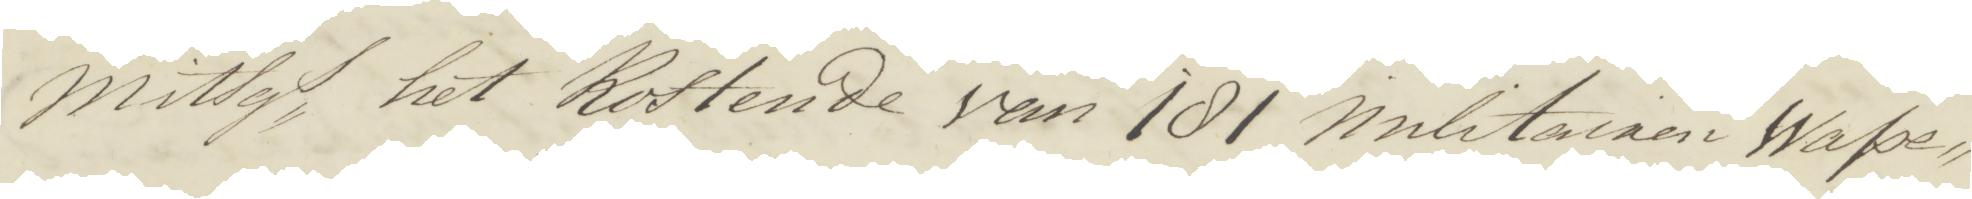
mitsg„s het kostende van 181 militairen wape„
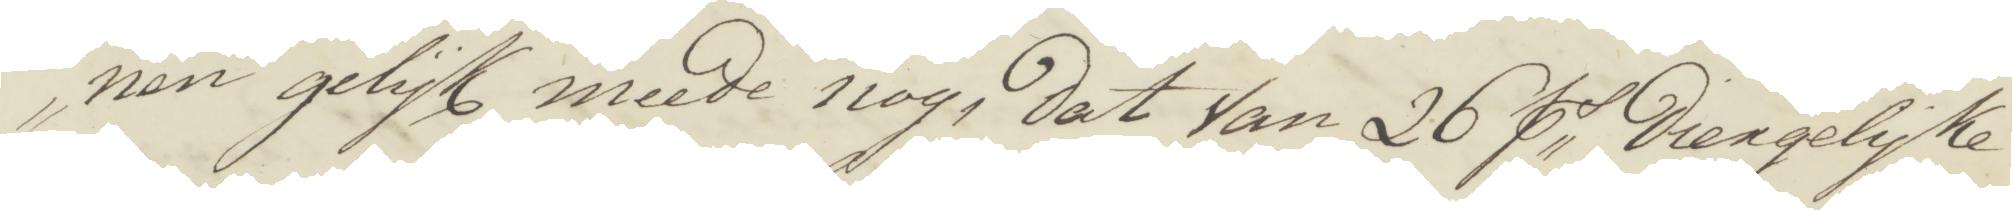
„nen gelijk meede nog, dat van 26 p„s diergelijke
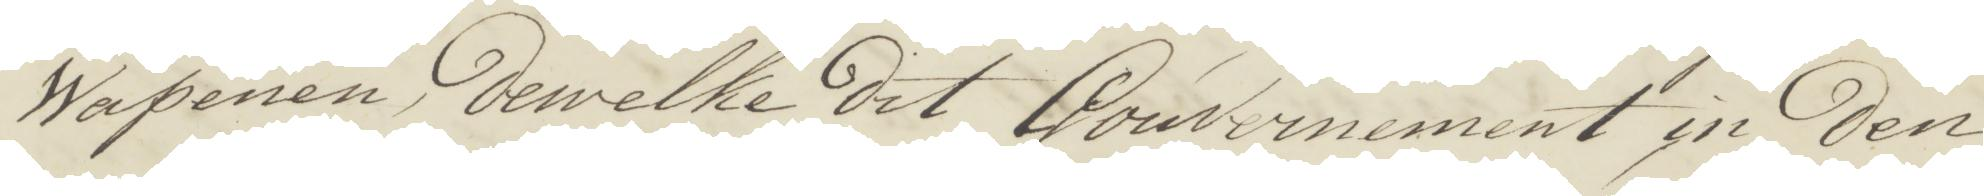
wapenen, dewelke dit Gouvernement in den
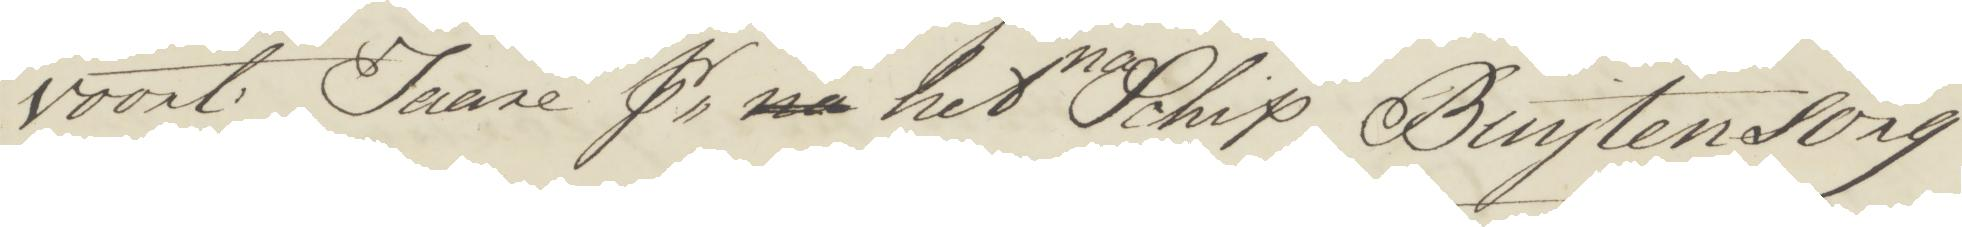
voorl: Iaare p„s na het na schip Buytensorg
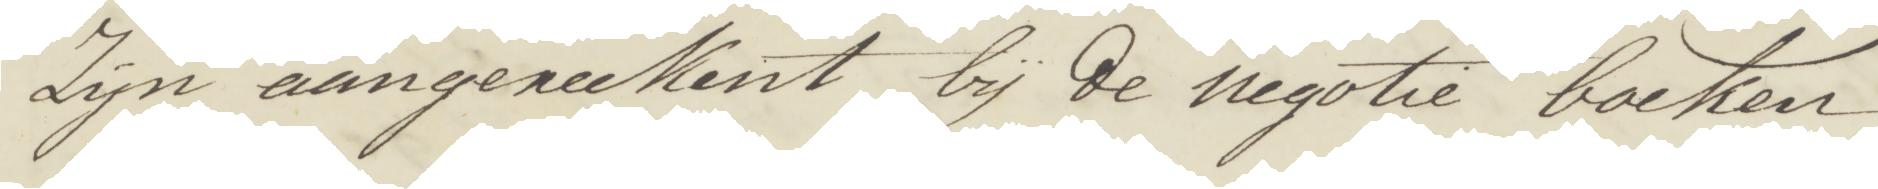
zijn aangereekent bij de negotie boeken
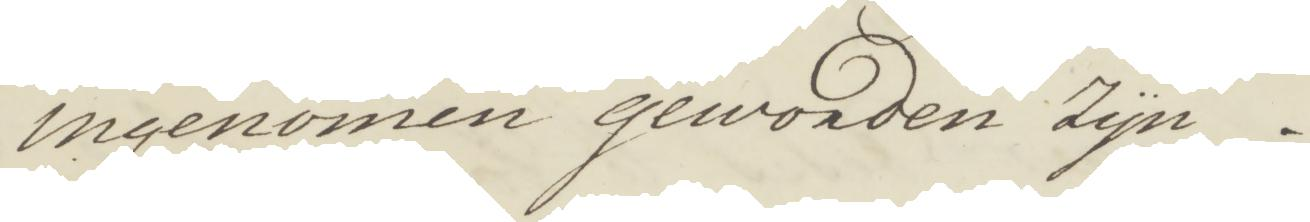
ingenomen geworden zijn.
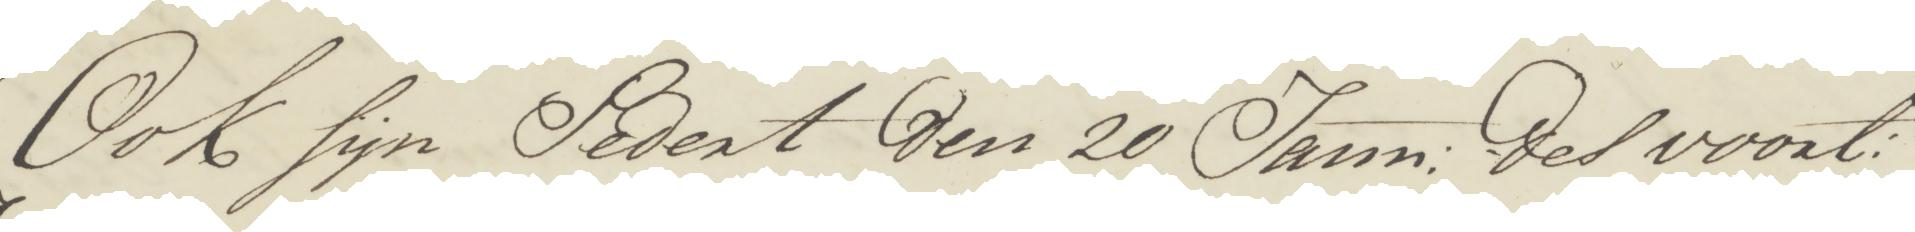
Ook sijn sedert den 20 Iann: des voorl:
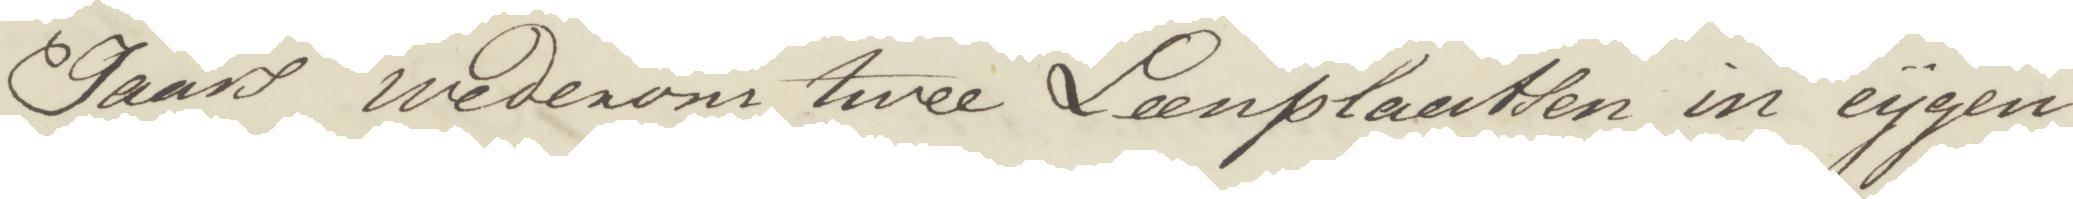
Iaars wederom twee Leenplaatsen in eijgen
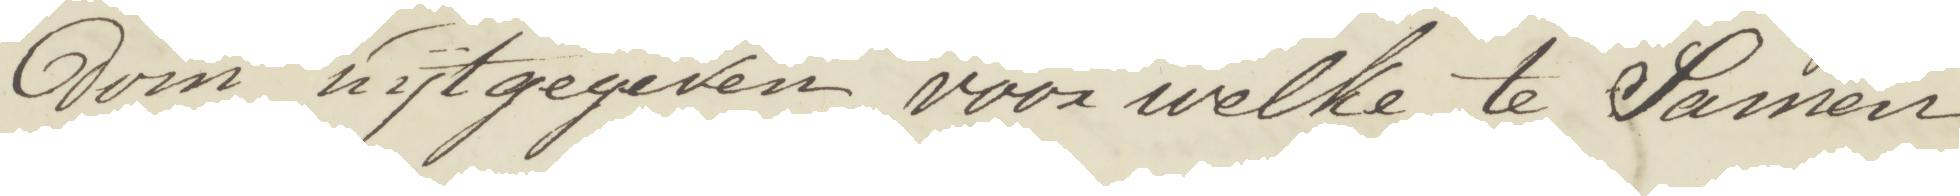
dom uijtgegeven voor welke te samen
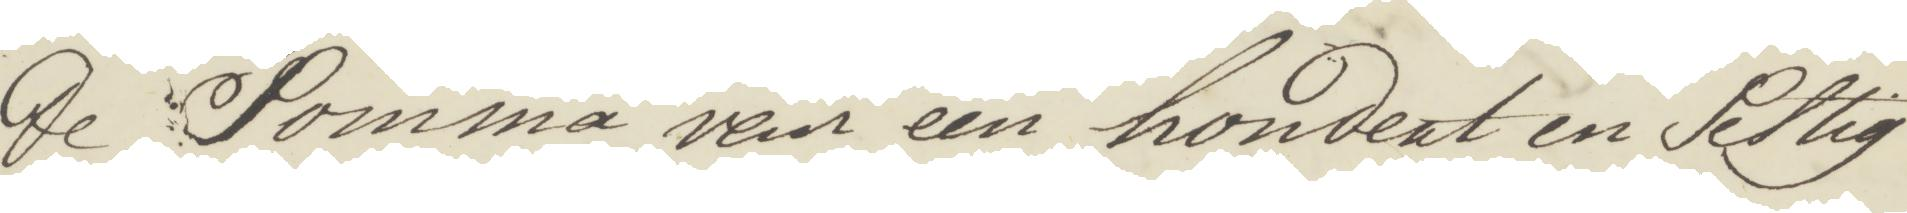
de somma van een hondert en sestig
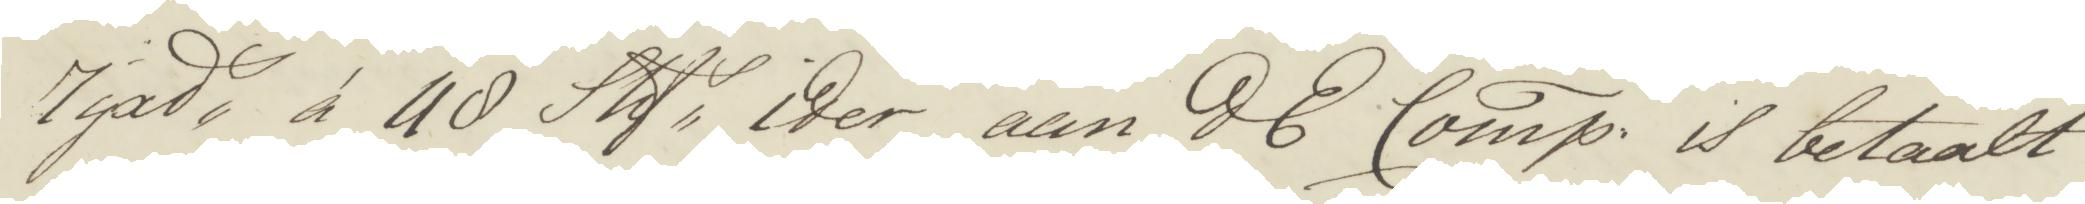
rijxd„s á 48 stver„s ider aan dE Comp: is betaalt
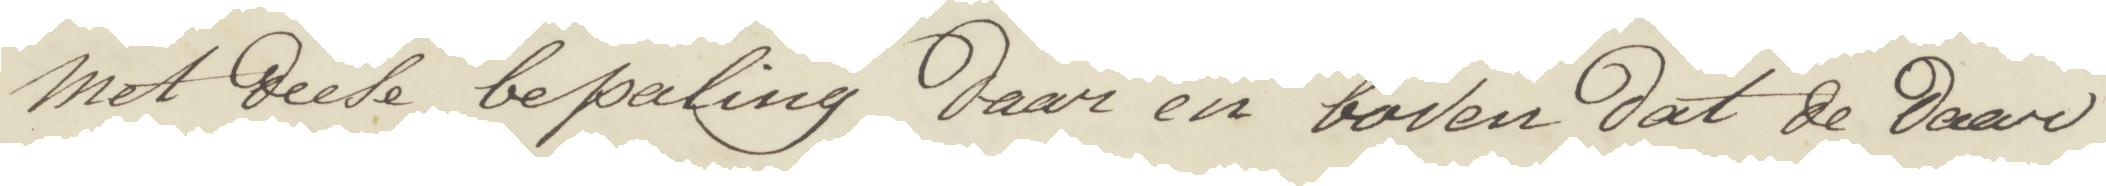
met deese bepaling daar en boven dat de daar
